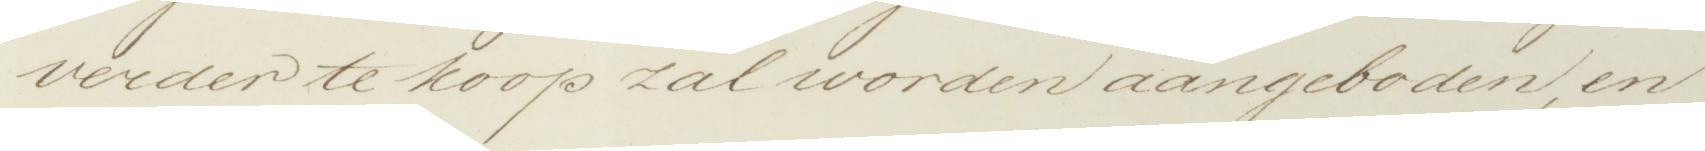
verder te koop zal worden aangeboden, en
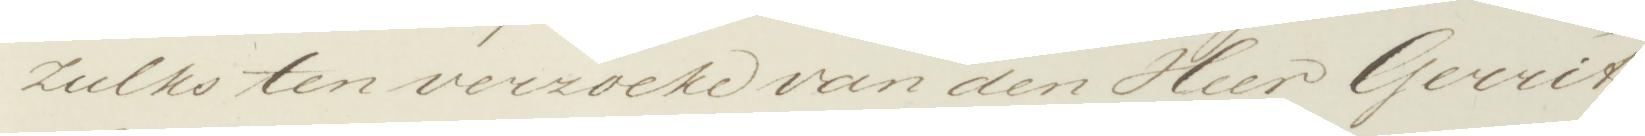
zulks ten verzoeke van den Heer Gerrit
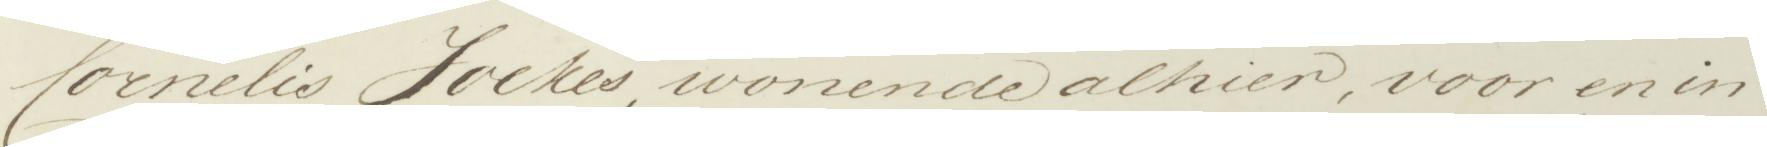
Cornelis Ioekes, wonende alhier, voor en in
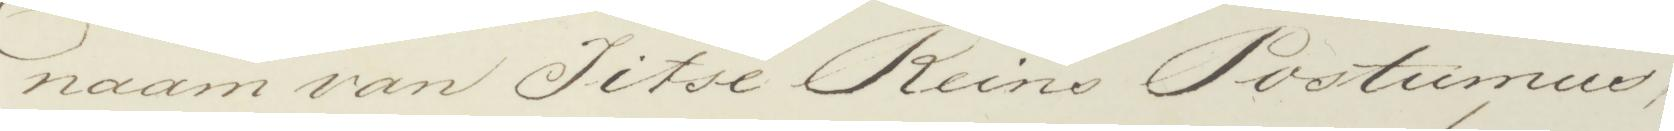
naam van Iitse Reins Postumus,
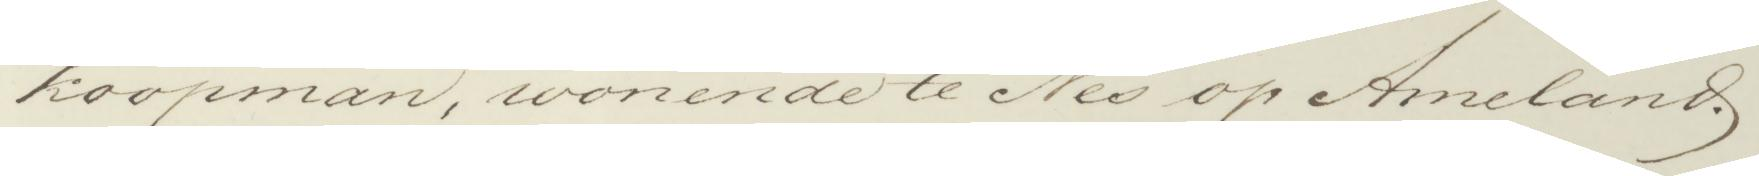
koopman, wonende te Nes op Ameland.
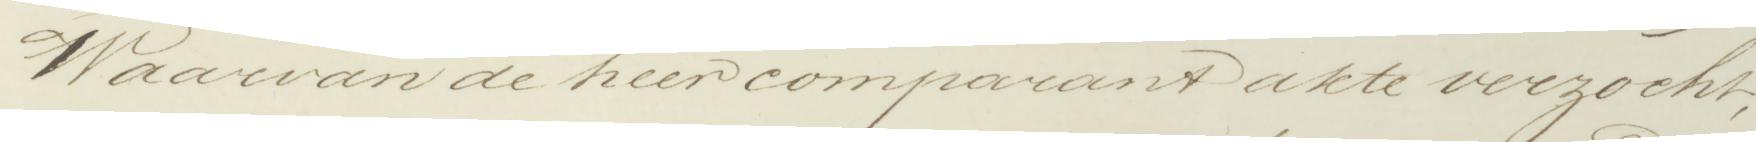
Waarvan de heer comparant akte verzocht,
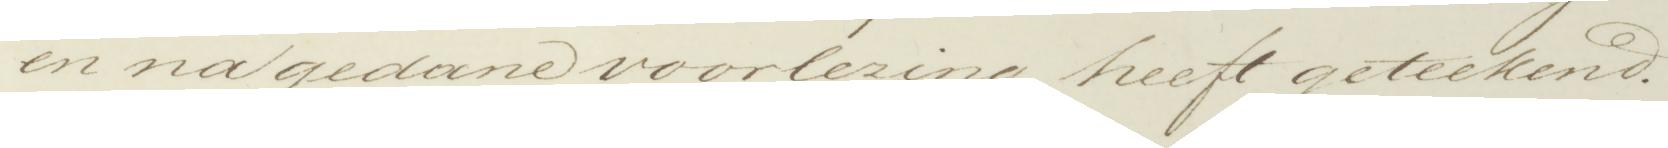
en na gedane voorlezing heeft geteekend.
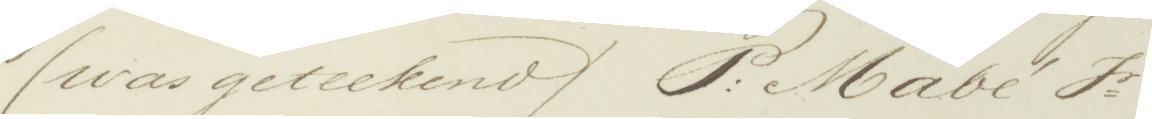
(was geteekend/ P: Mabé J:r
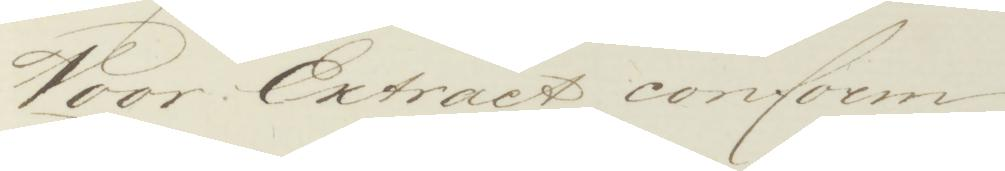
Voor: Extract conform
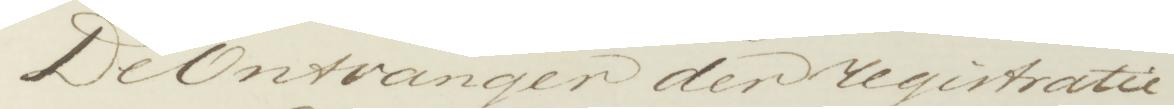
De Ontvanger der registratie
